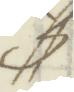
H
